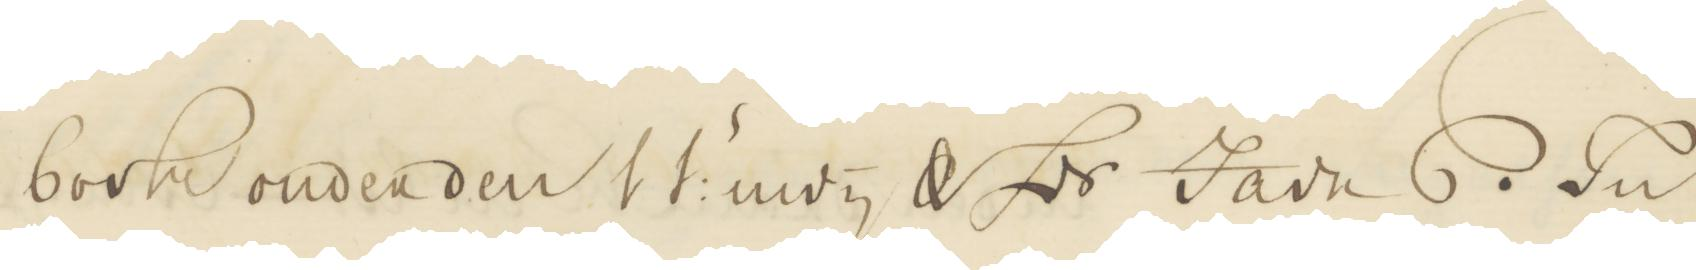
boek onder den 11:' meij deses Jaer s. En
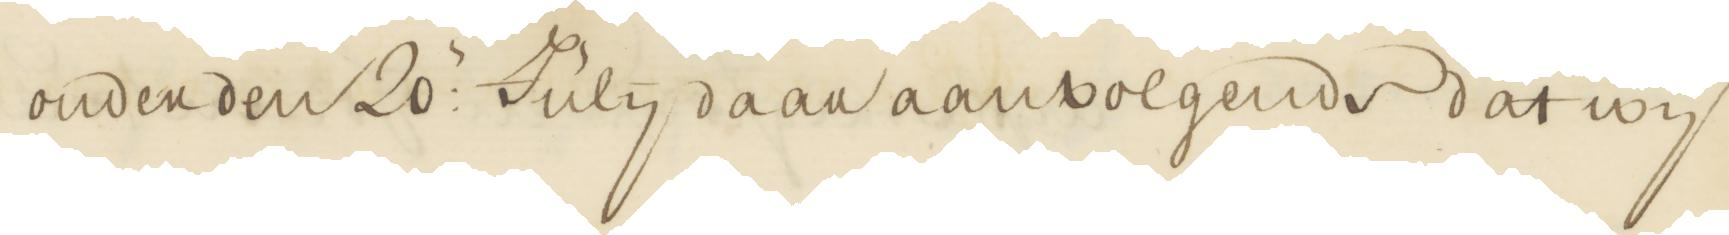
onder den 20:' Julij daar aan volgende dat wij
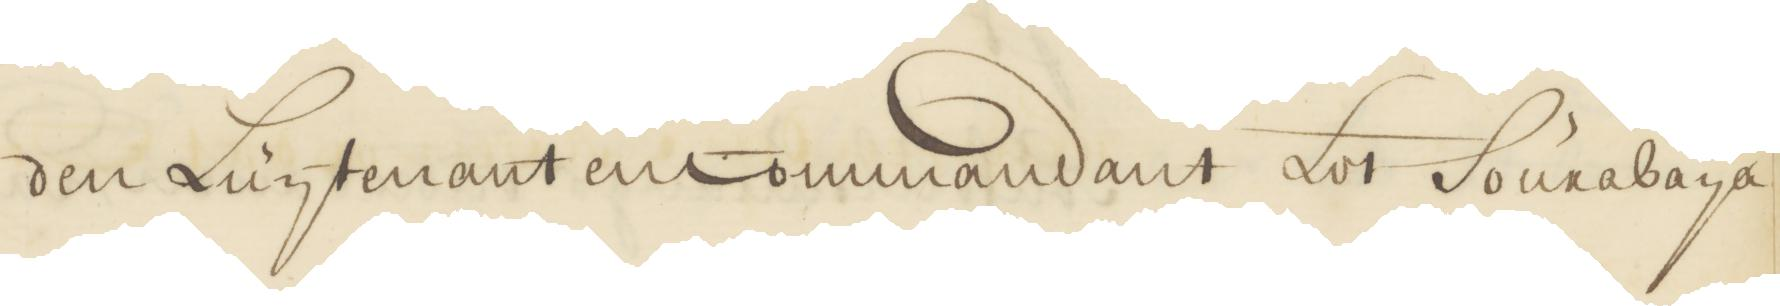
den luijtenant en commandant tot Sourabaija
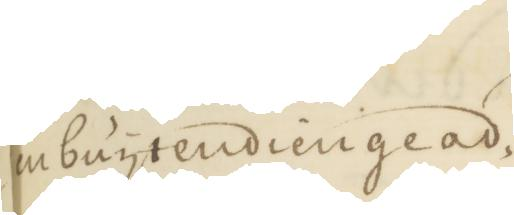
en buijten dien gead„
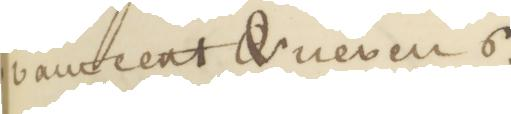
vanceert de nevens
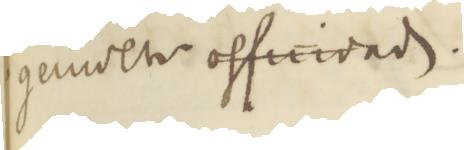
gemelte officieren.
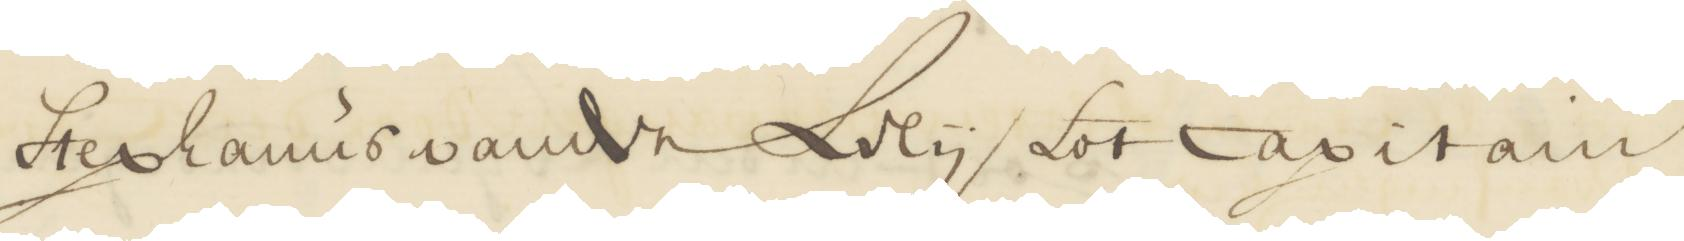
Stephanus vander Lelij tot capitain
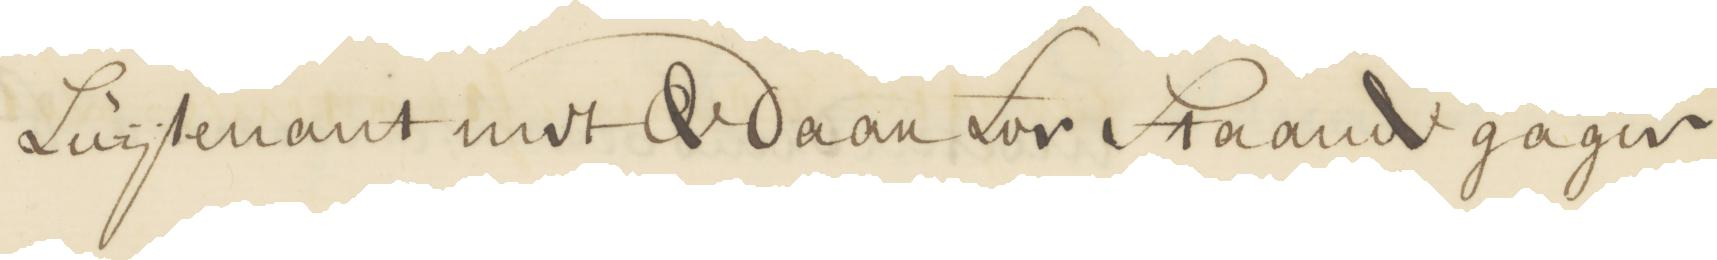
Luijtenant met de daar ter staande gagie
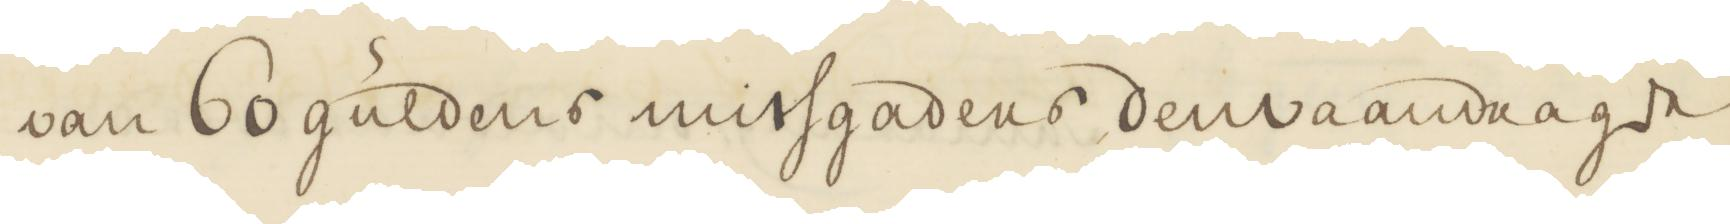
van 60 guldens mitsgaders den vaandrager
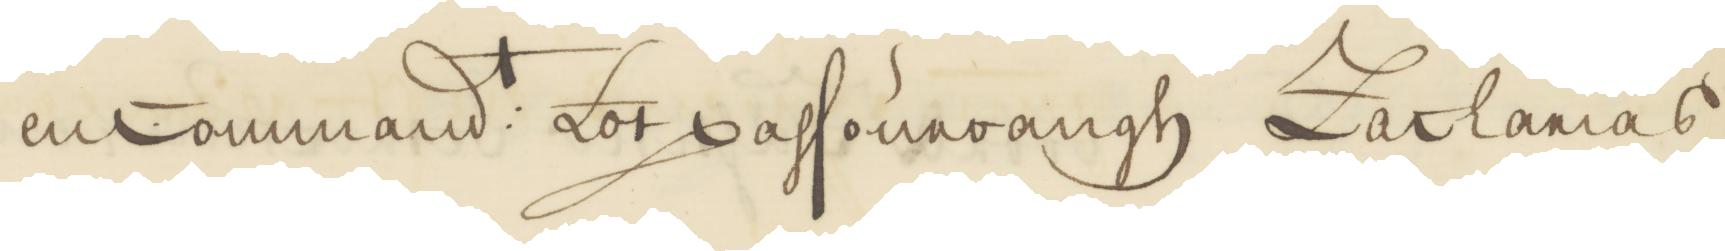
en Command:t tot passouroangh Zacharias
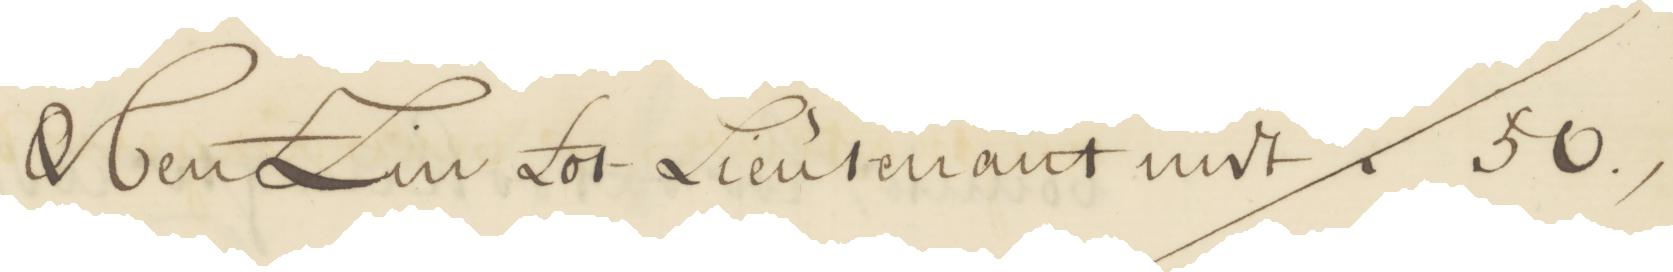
de ben Zin tot Lieutenant met ƒ50.,
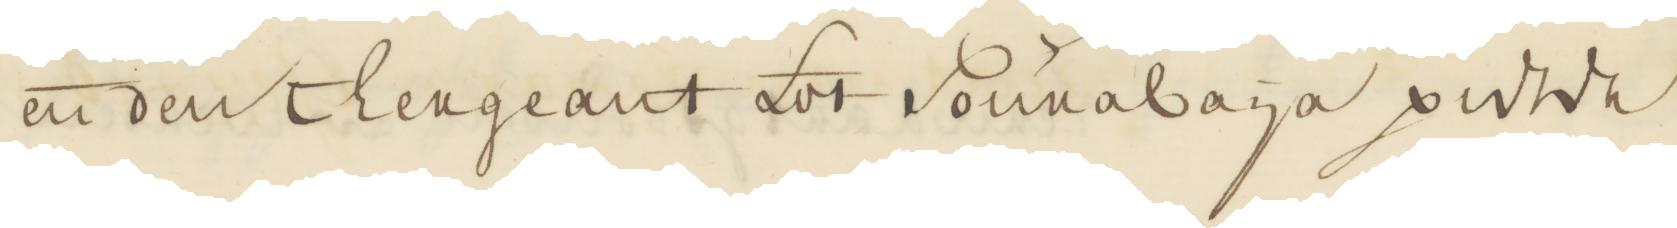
en den chergeant tot sourabaija pieter
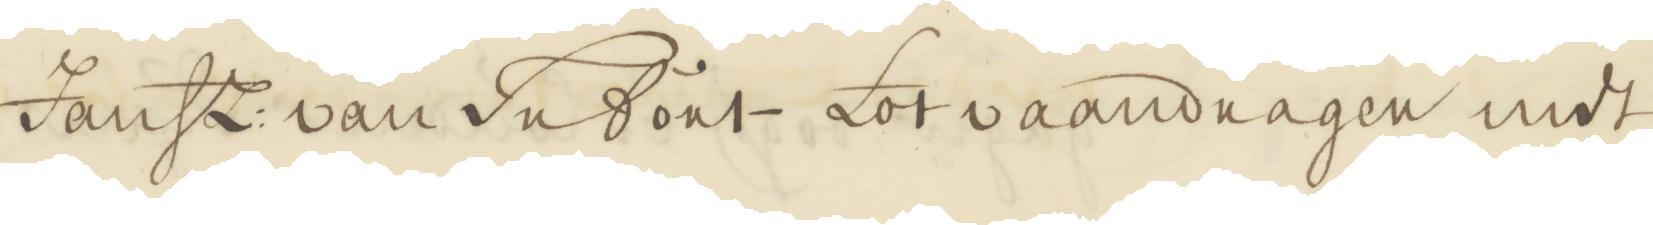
Jansz: van Erfort tot vaandrager met
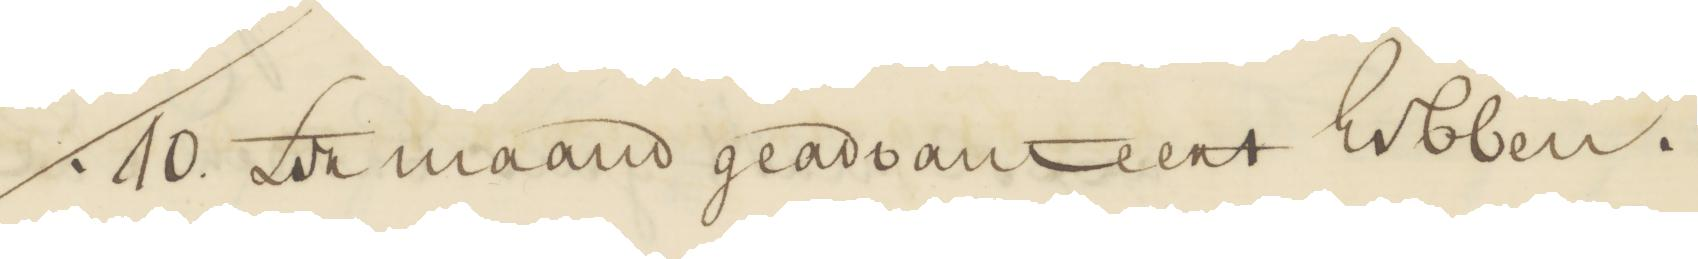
ƒ40. ter maand geadvanceert hebben.
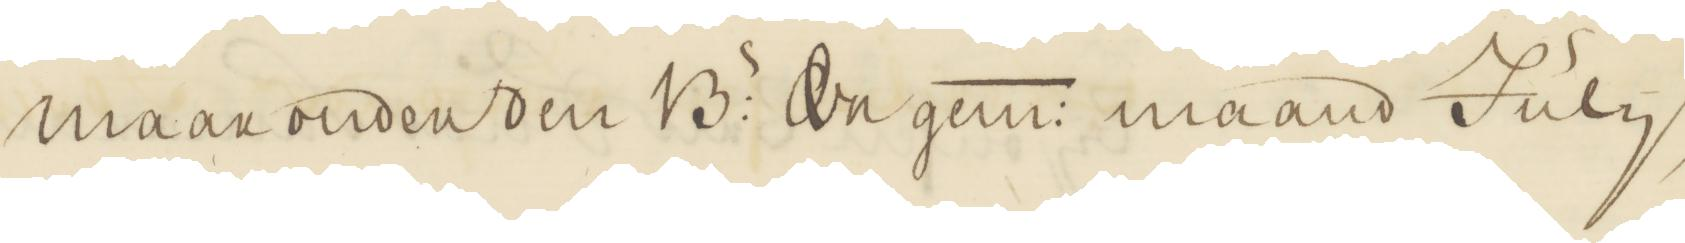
maar onden den 13:' der gem: maand Julij
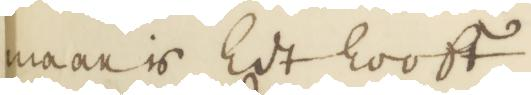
maar is het hooft
